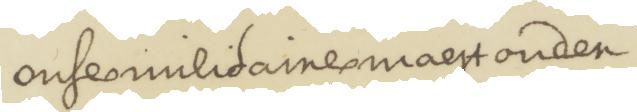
onse militaire magt onder
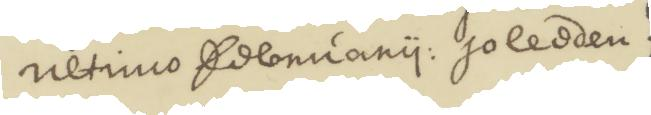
ultimo februarij: jo leeden
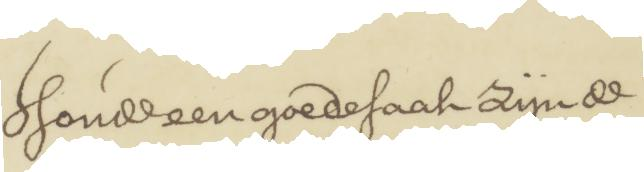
t soude een goedesaak zijn de
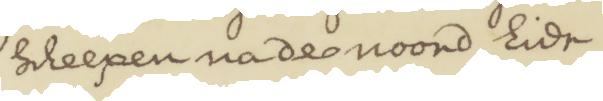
scheepen na de noord hier
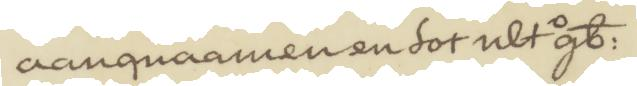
aanquaamen en tot ulto gb:
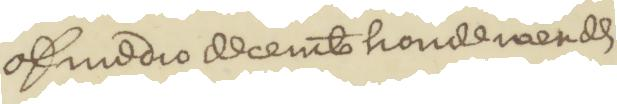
of medio decemb konde werden
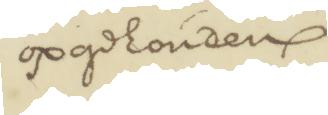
opgehouden
